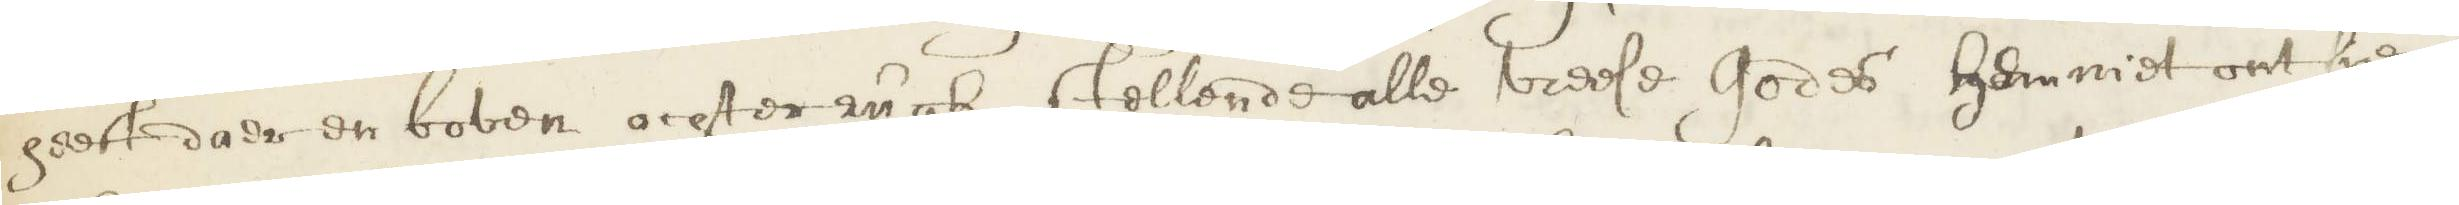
heeft daer en boven achter rugh stellende alle vreese godes hem niet ont sien
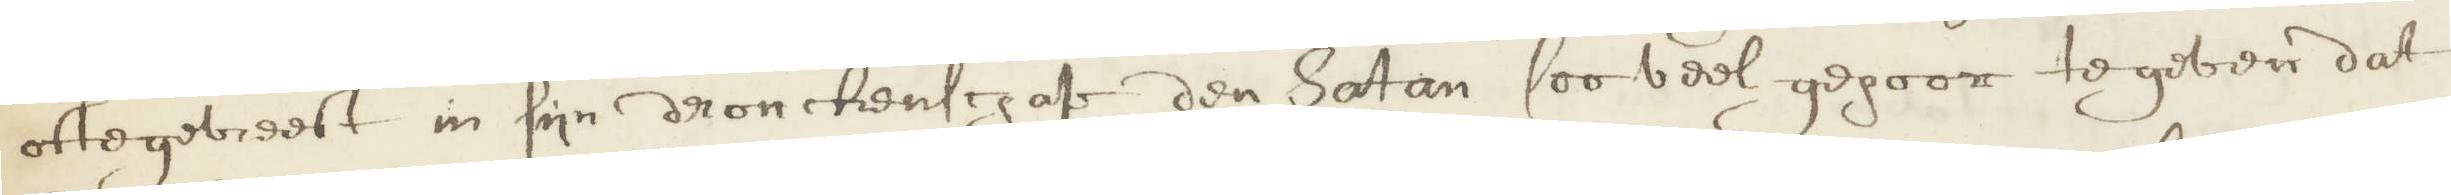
ofte gevreeft in sijn dronckenschap den satan soo veel gehoor te geven dat
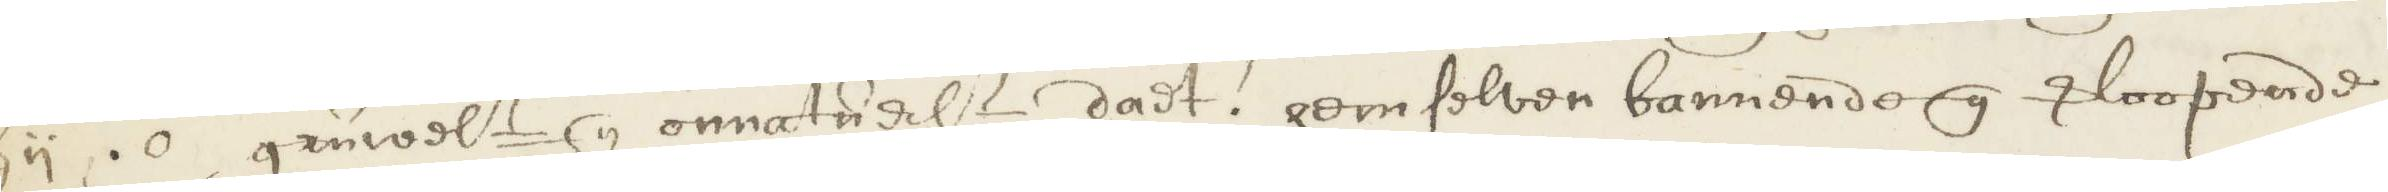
hij . ô gruwelijk onnatuerlijk daet! hemselven bannende ende verloopende
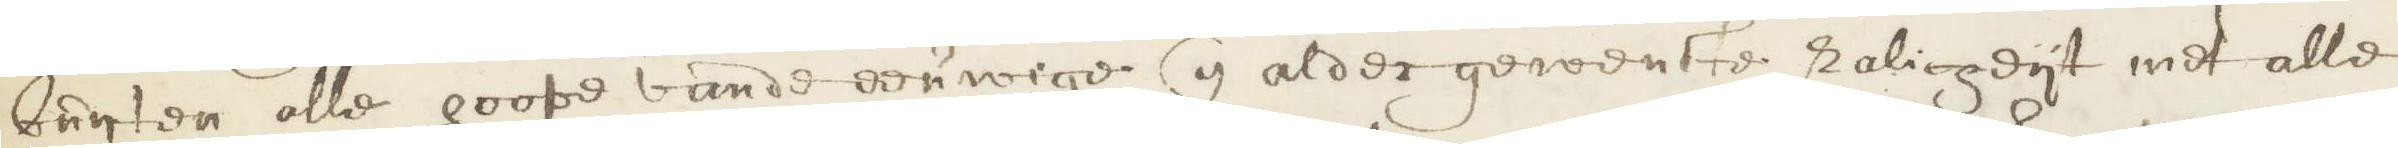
buyten alle hoope vande eeuwige ende alder gewenste zalicheijt met alle
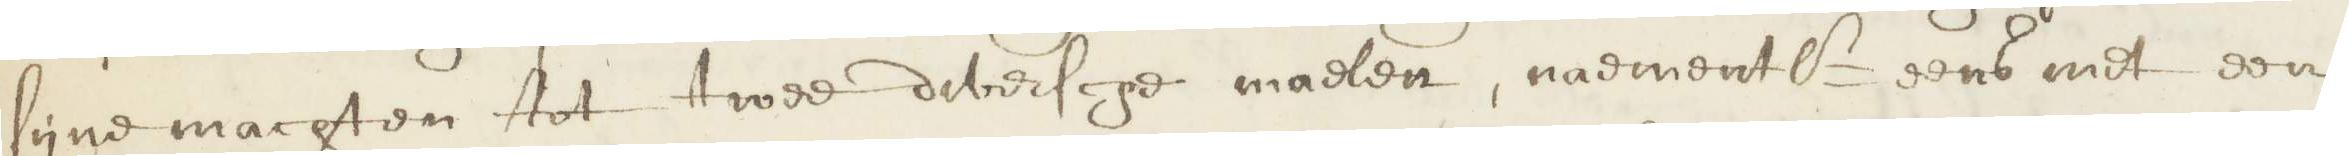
sijne machten tot twee diversche maelen, naementlijk eens met een
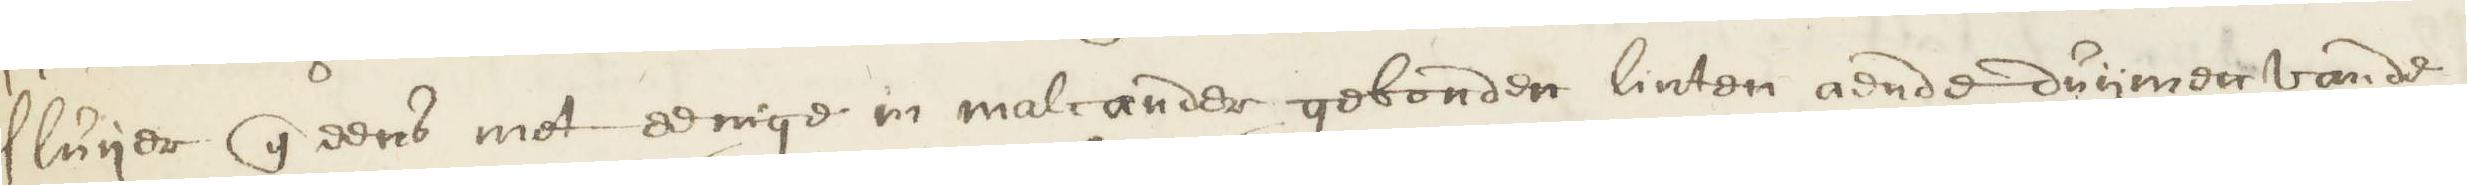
sluijer ende eens met eenige in malcander gebonden linten aende duijmen van de
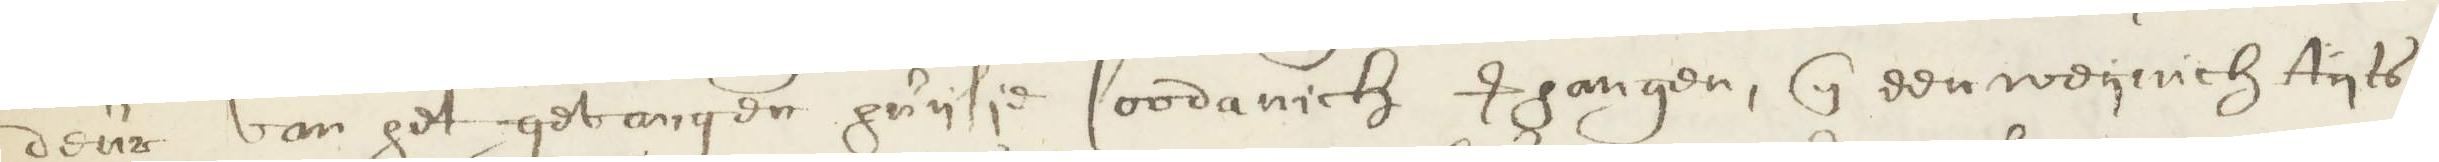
deur van het gevangen huijsje soodanich verhangen, ende een weijnich tijts
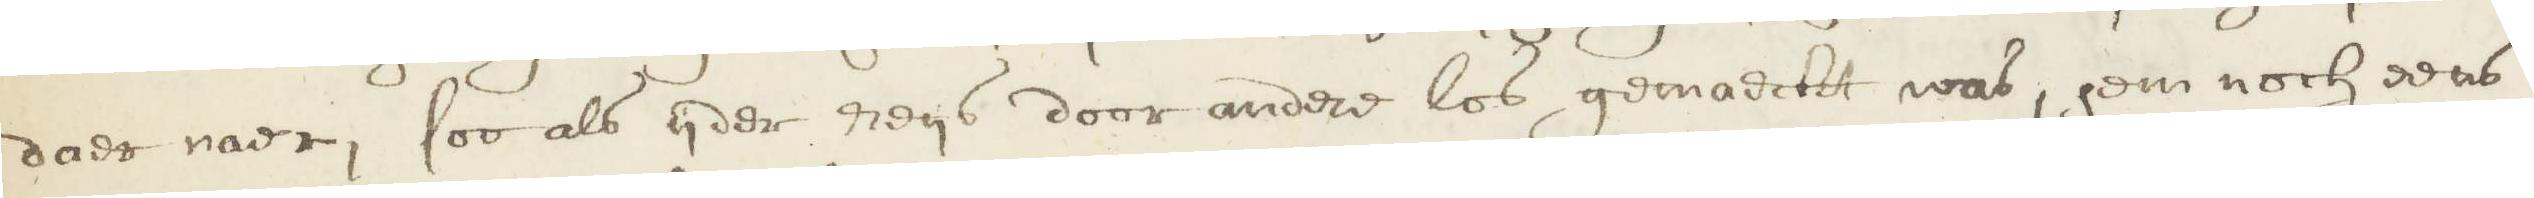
daer naer, soo als ijderrheijs door andere los gemaeckt was, hem noch eens
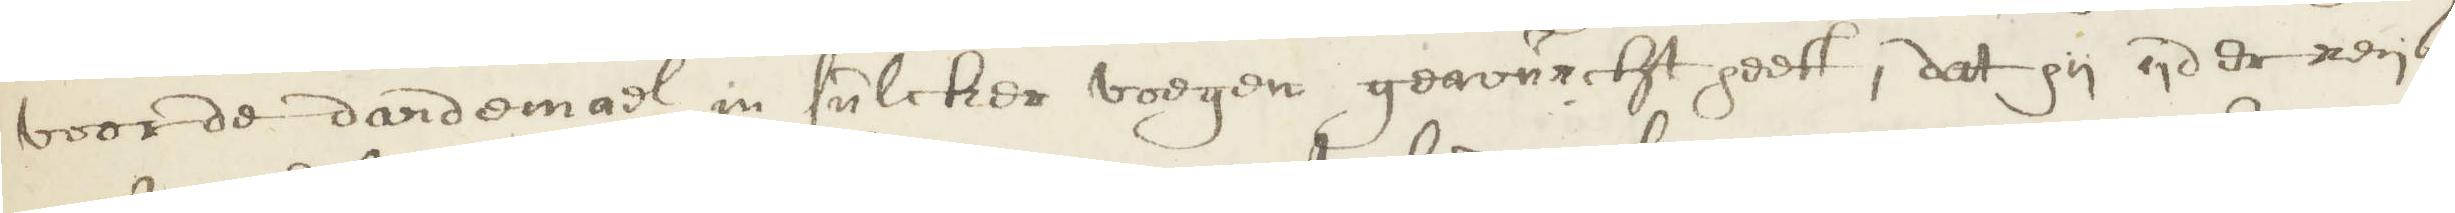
voor de dandemael in sulcker voegen gevoucht heeft, dat hij ijder reijs
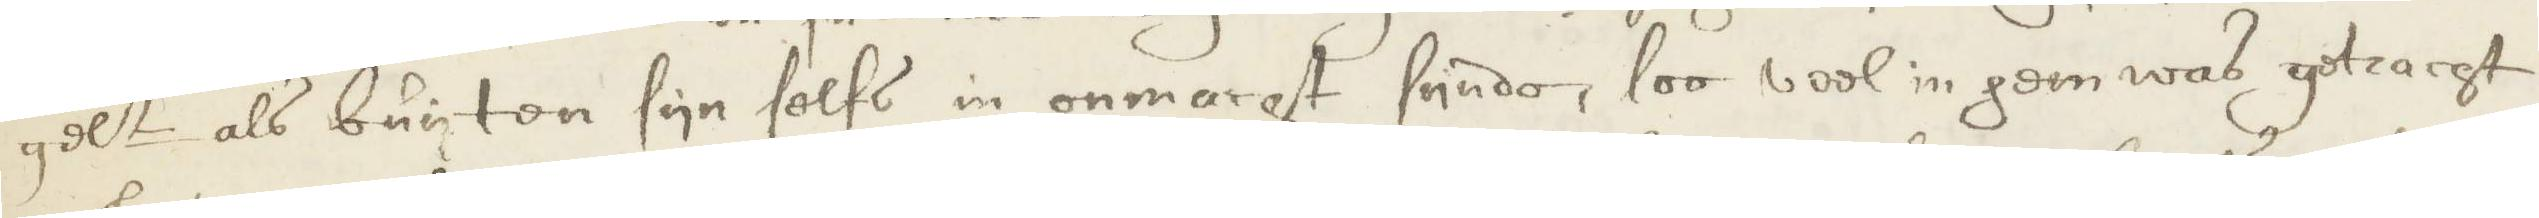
gelijk als buijten sijn selfs in onmacht sijnde, soo veel in hem was getracht
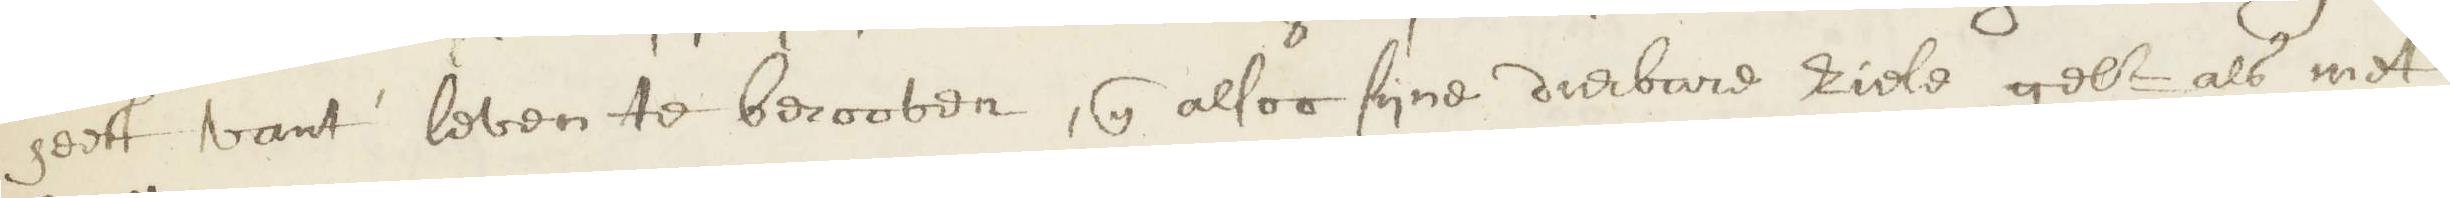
heeft vant' leven te berooven, ende alsoo sijne diebare ziele gelijk als met
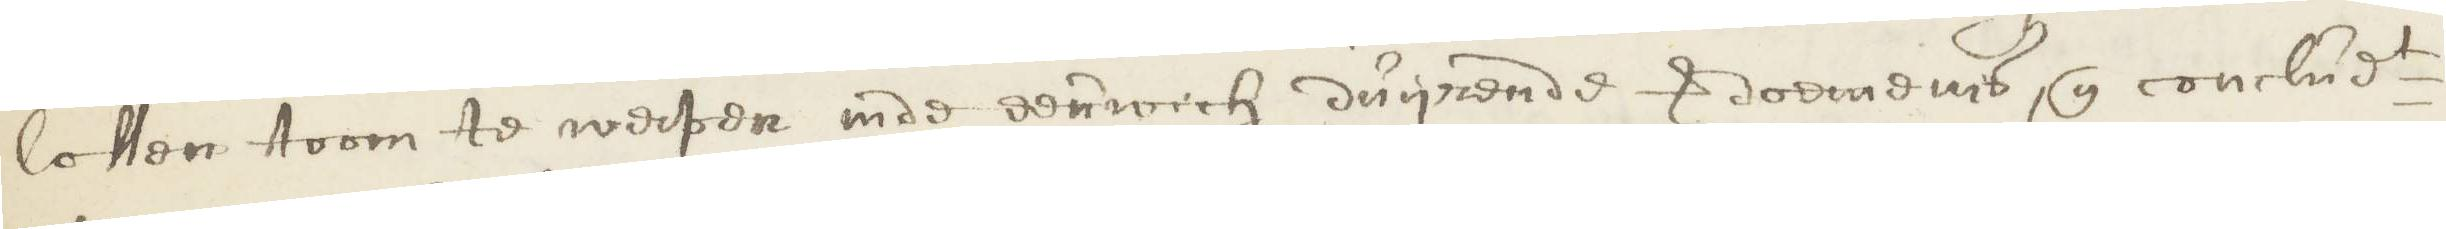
lossen toom te werpen inde eeuwich duijzende verdoemenis, ende conclud=t
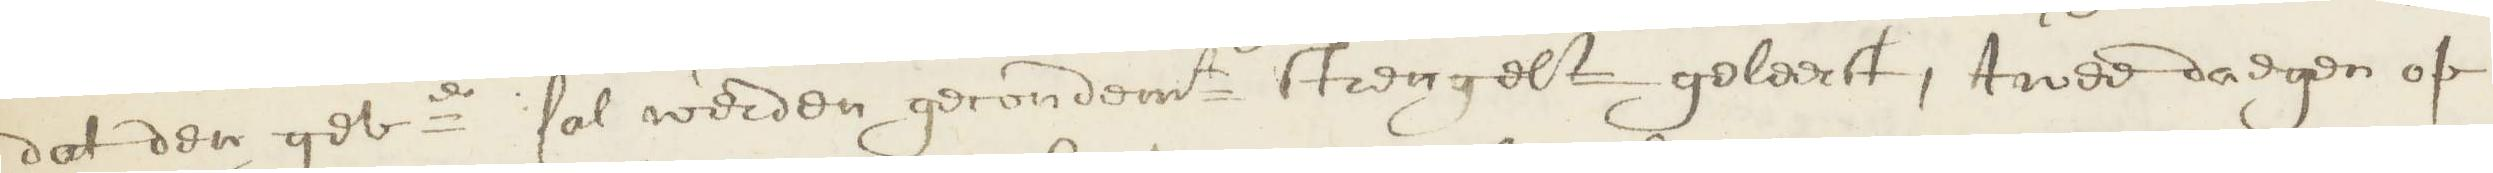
dat den geb=e sal werden gecondem=t strengelijk geleerst, twee daegen op
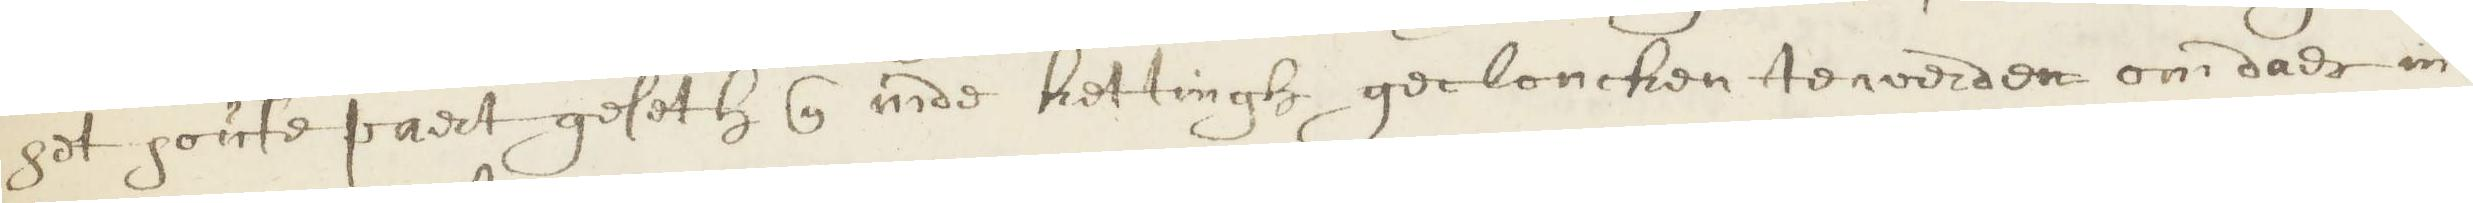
het houfe paert geseth ende inde kettingh gecloncken te werden om daer in
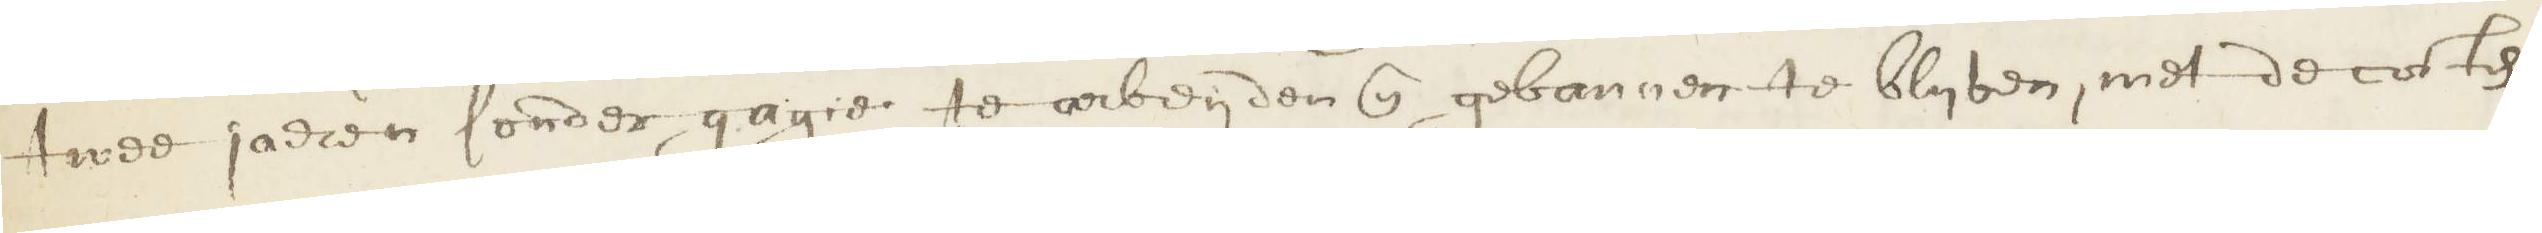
twee jaeren sonder gagie te arbeijden ende gebannen te blyven, met de costen
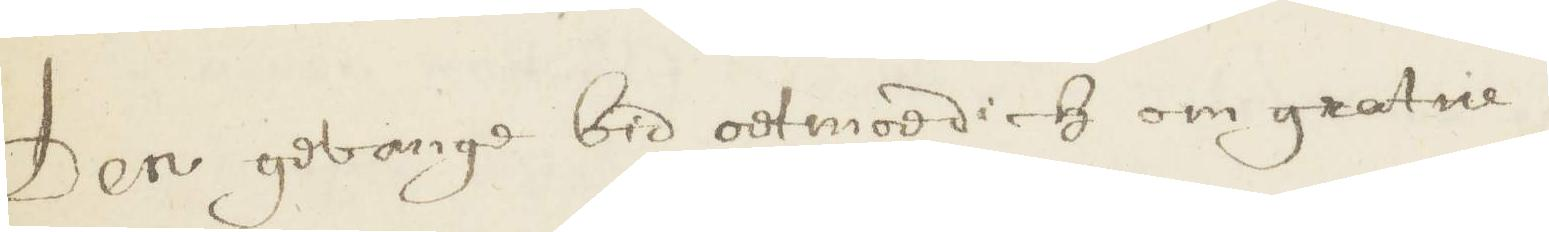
Den gevange bid oetmoedich om gratie
